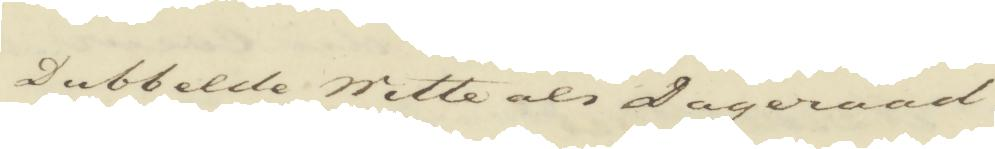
Dubbelde witte als Dageraad
